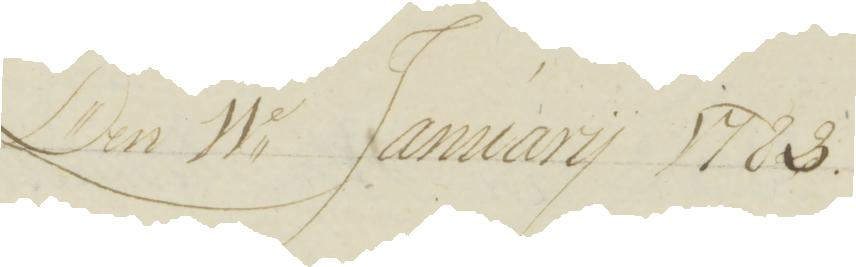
Den 11„e Januarij 1783.
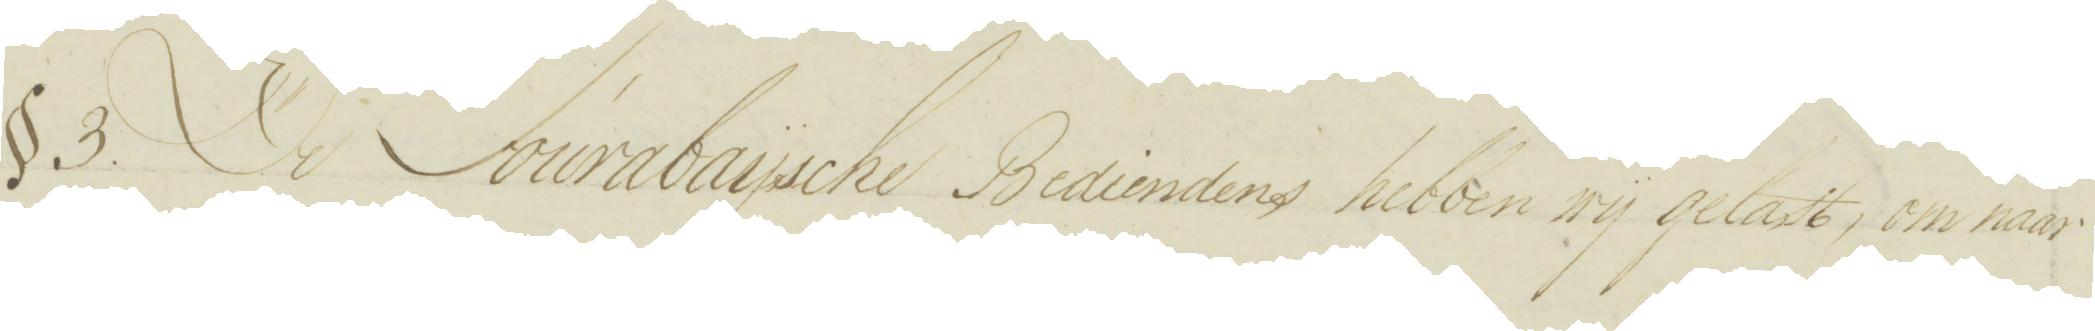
§ 3. De Sourabaijsche Bediendens hebben wij gelast, om naar
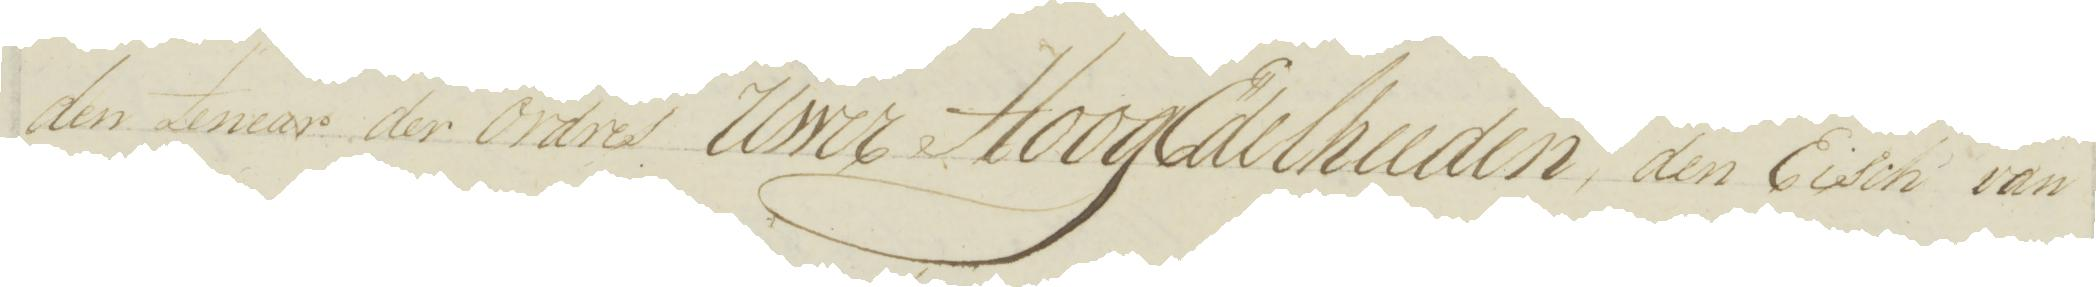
den tenear der Ordres Uwer Hoog Edelheeden, den Eisch van
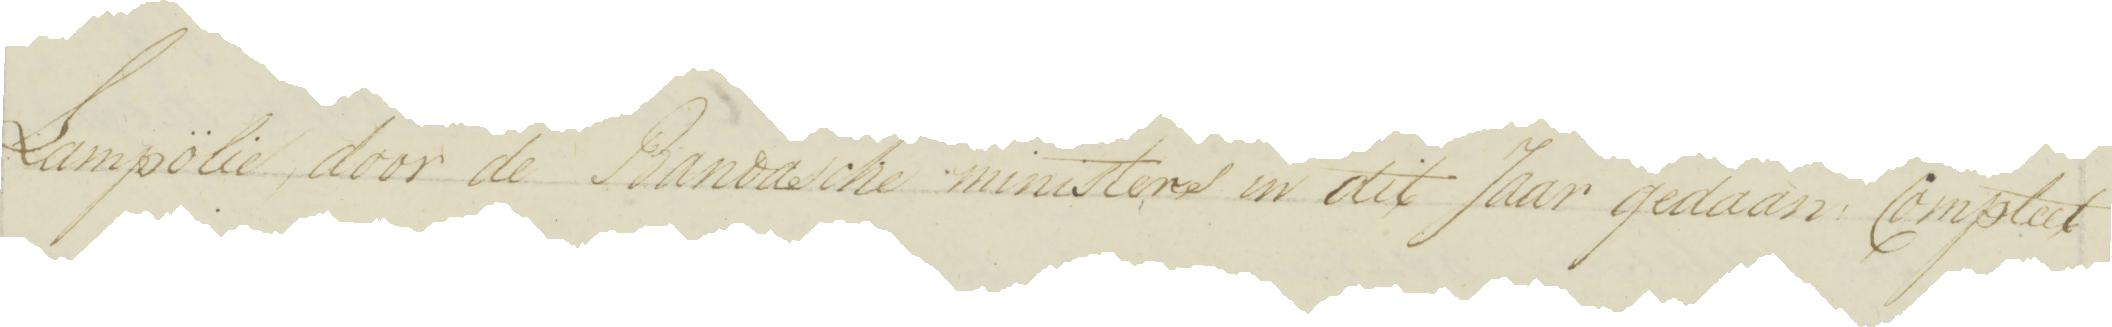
Lampölie door de Bandasche ministers in dit Jaar gedaan: Compleet
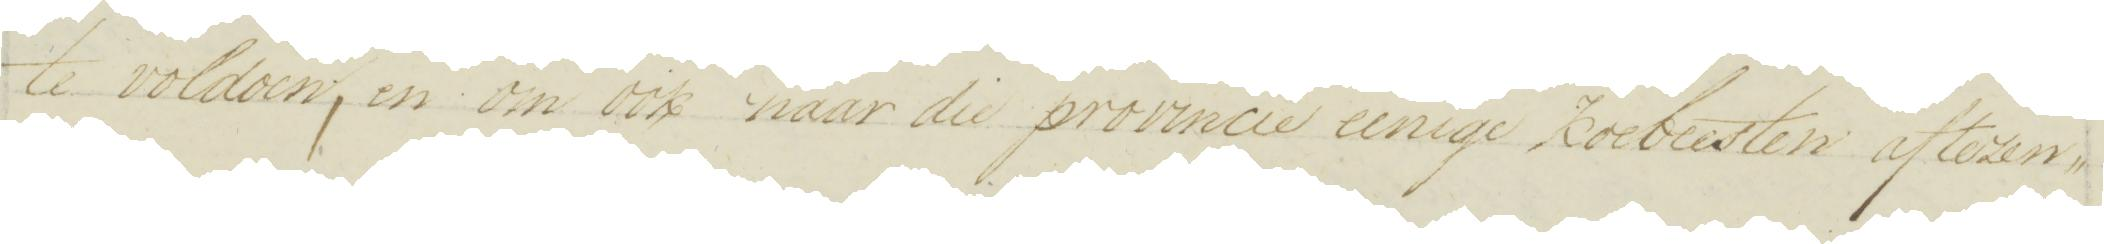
te voldoen, en om ook naar die provincie eenige koebeesten aftezen„
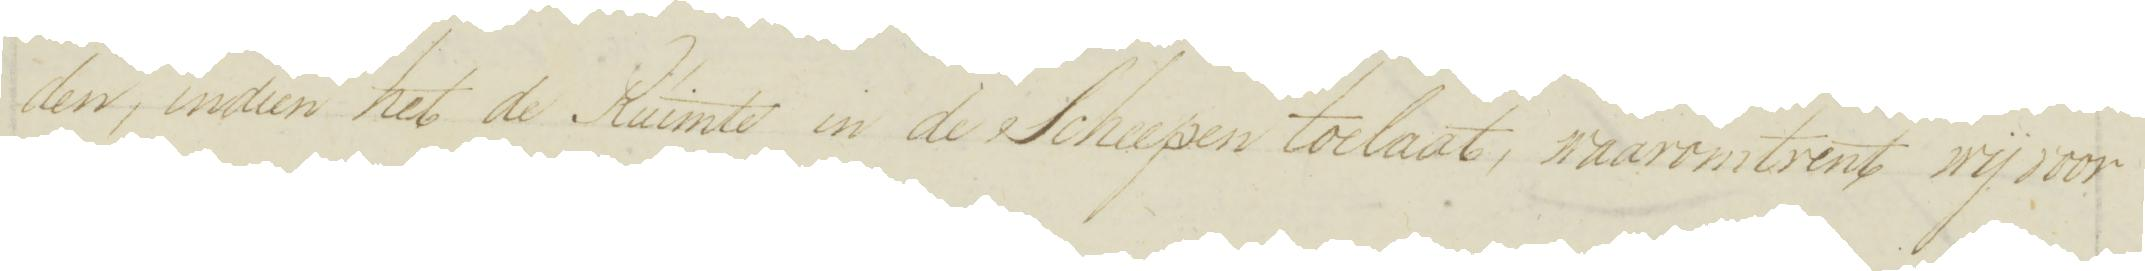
den, indien het de Ruimte in de scheepen toelaat, waaromtrent wij voor
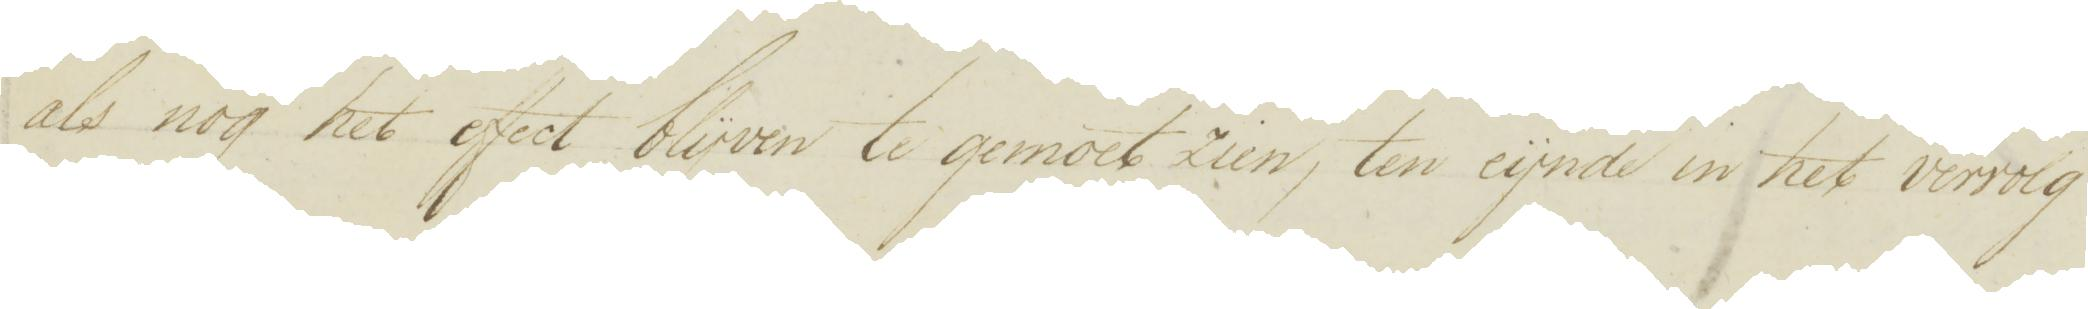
als nog het effect blijven te gemoet zien, ten eijnde in het vervolg
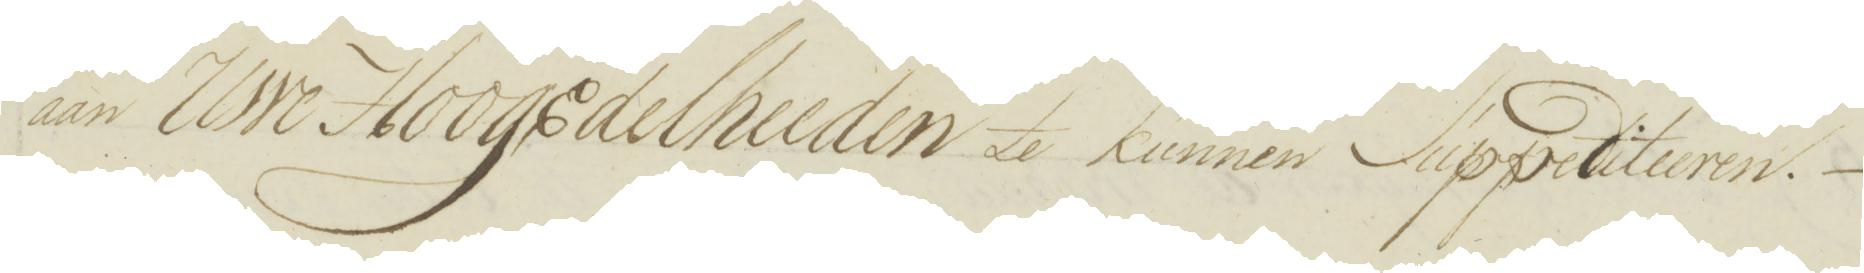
aan Uwe Hoog Edelheeden te kunnen suppediteeren. —
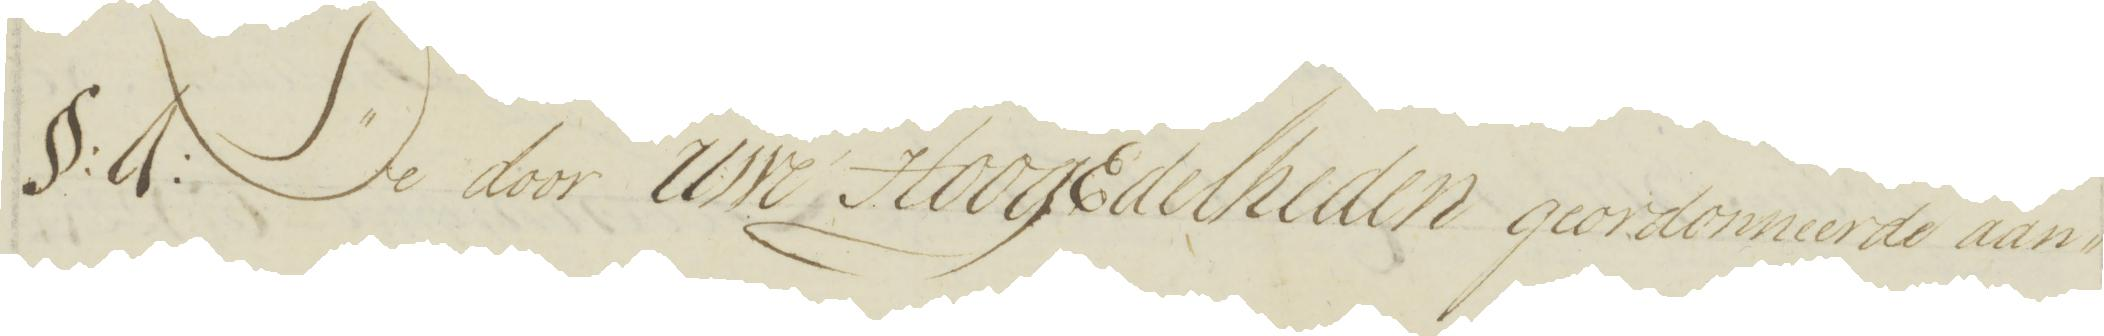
§: 4: De door Uwe Hoog Edelheden geordonneerde aan
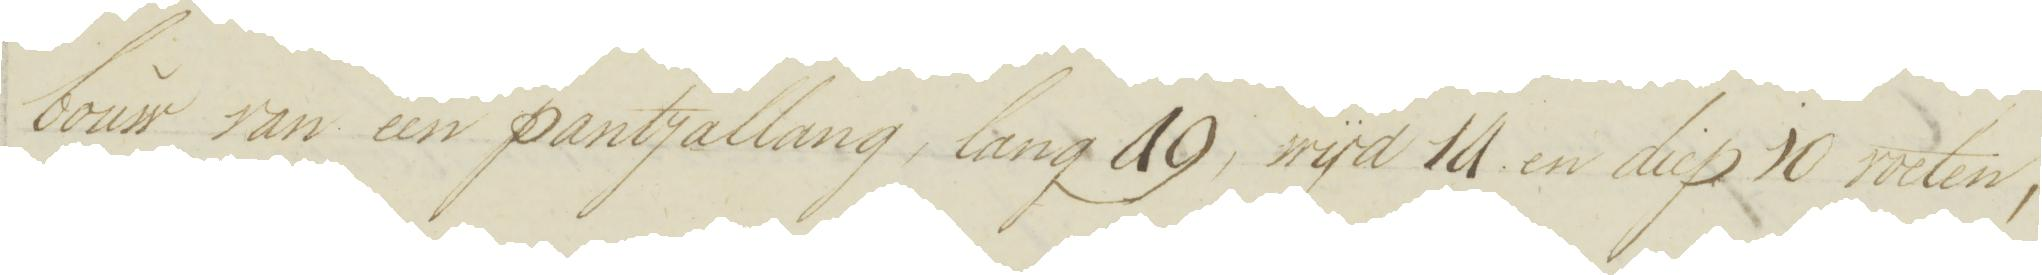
bouw van een pantjallang, lang 49, wijd 14. en diep 10 voeten,
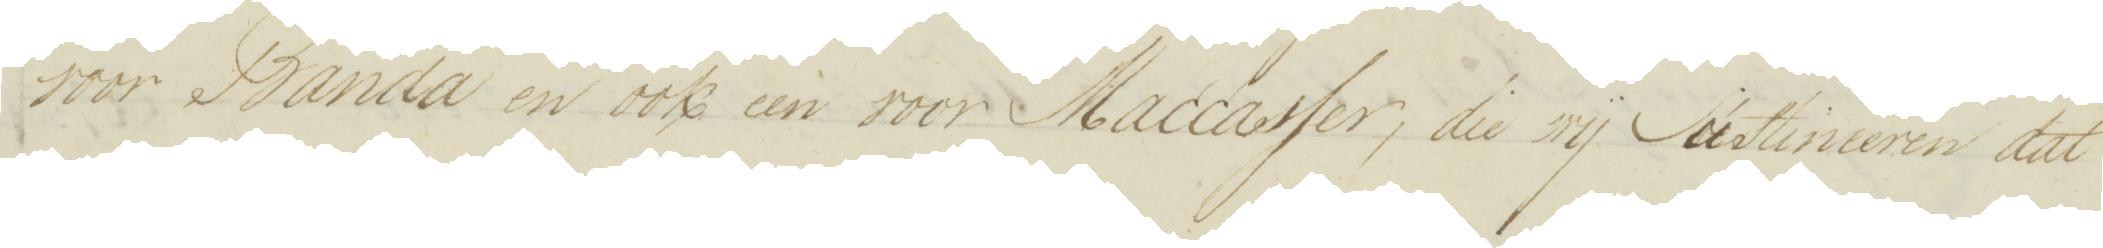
voor Banda en ook een voor Maccasser, die wij sustineeren dat
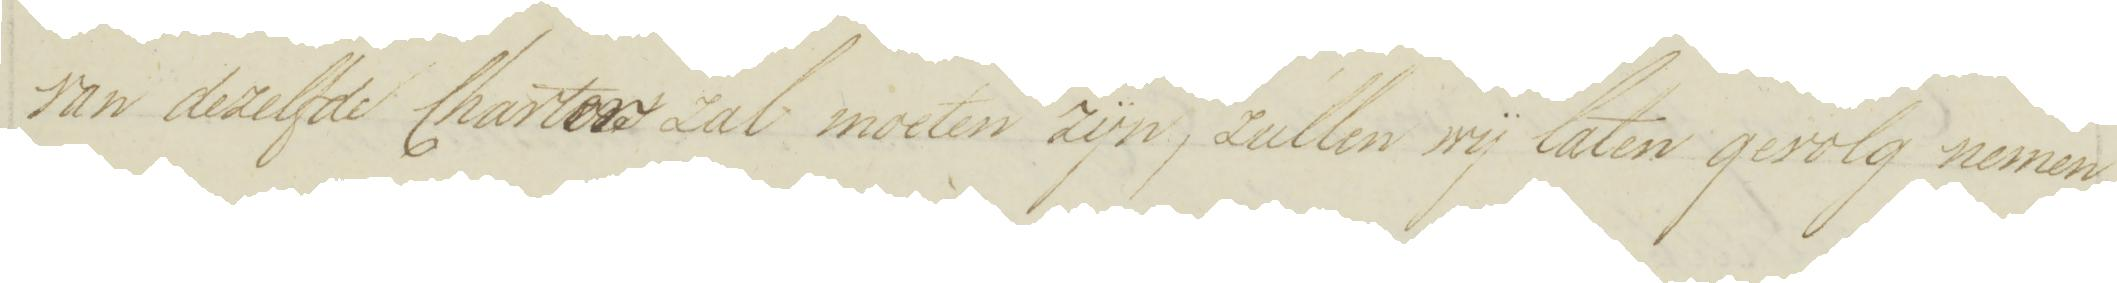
van dezelfde Charter zal moeten zijn, zullen wij laten gevolg nemen,
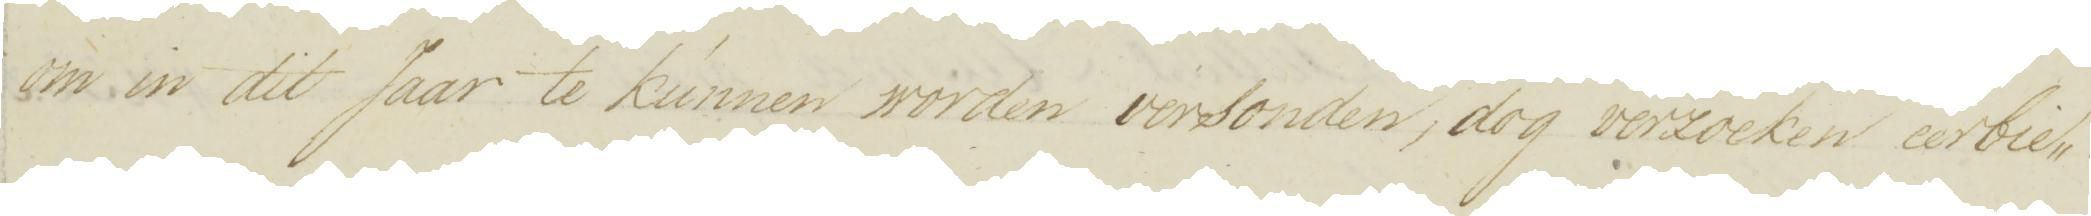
om in dit Jaar te kunnen worden versonden, dog verzoeken eerbie„
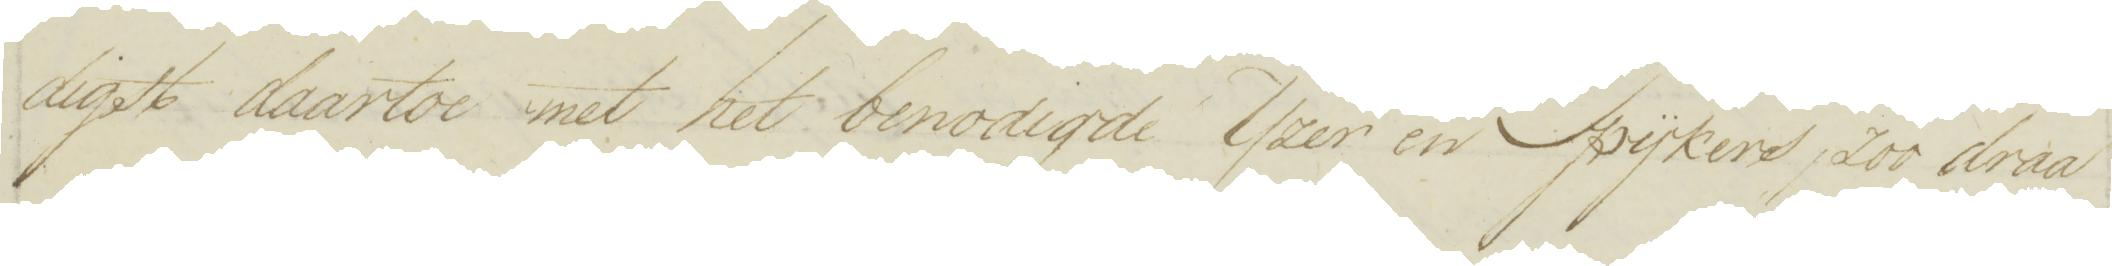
digst daartoe met het benodigde IJzer en spijkers, zoo draa
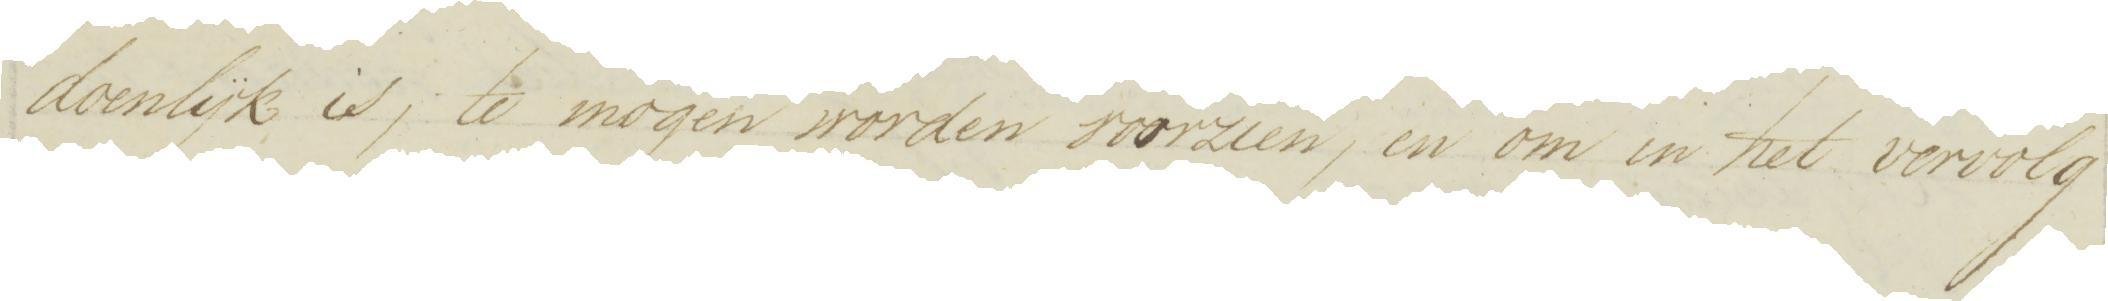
doenlijk is, te mogen worden voorzien, en om in het vervolg
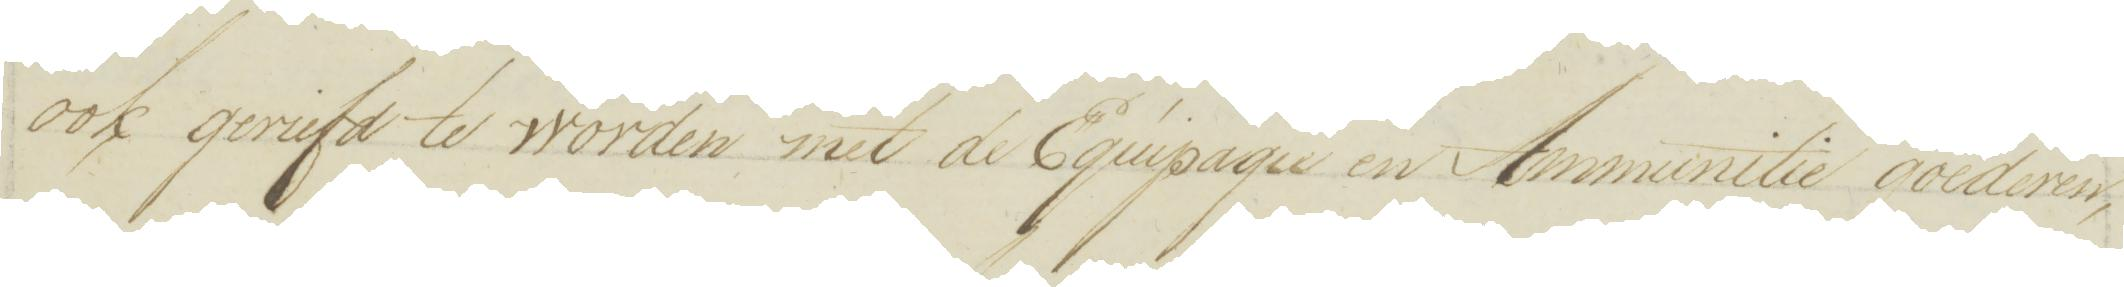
ook geriefd te worden met de Equipagie en Ammunitie goederen,
